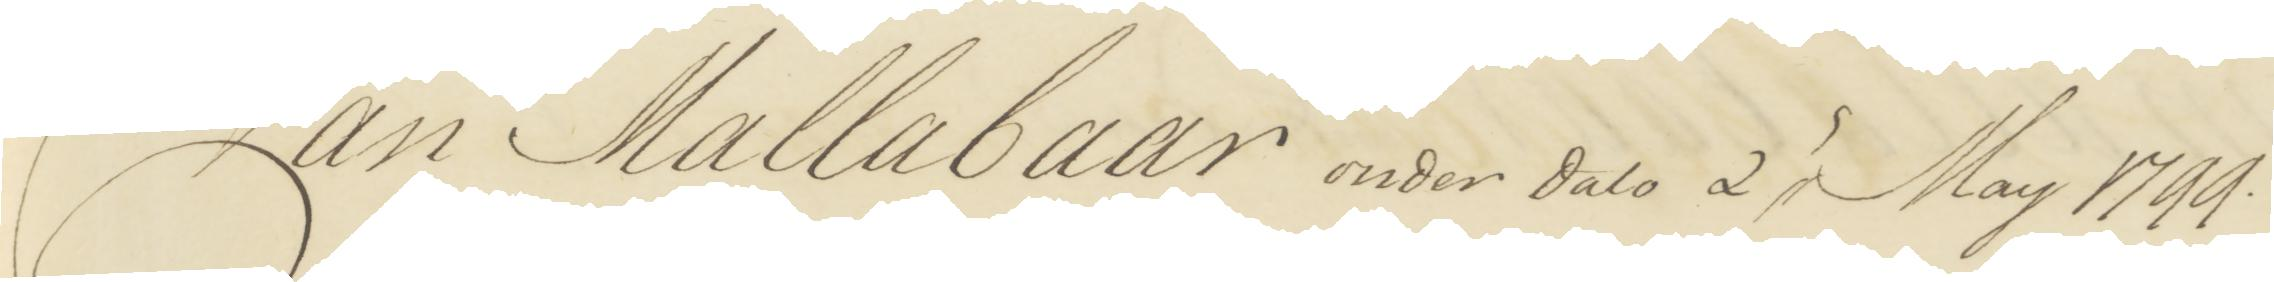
Van Mallabaar onder dato 2„' May 1744.
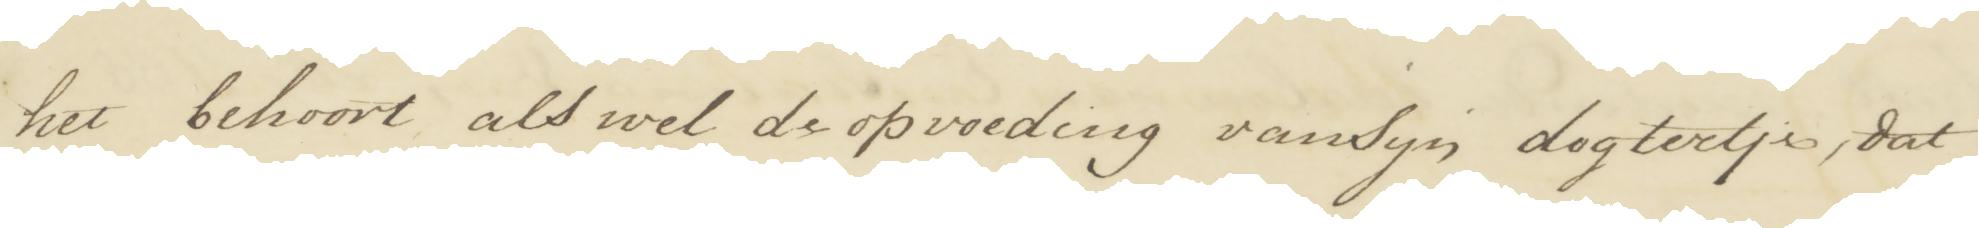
het behoort als wel de opvoeding vansyn dogtertje, dat
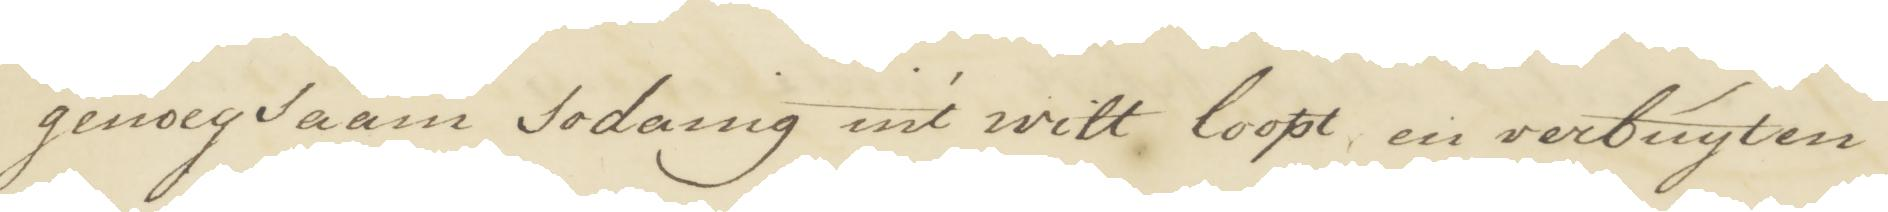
genoegsaam sodanig in't wilt loopt en verbuyten
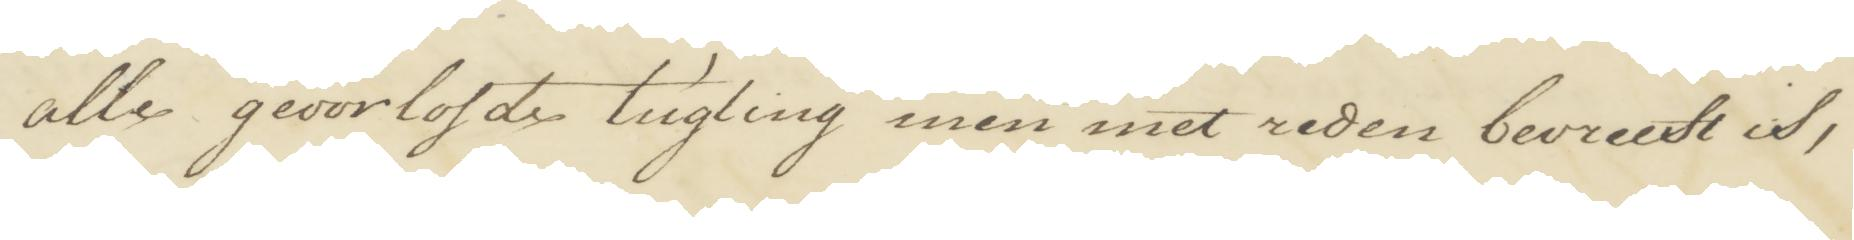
alle geoorlofde tugting men met reden bevreest is,
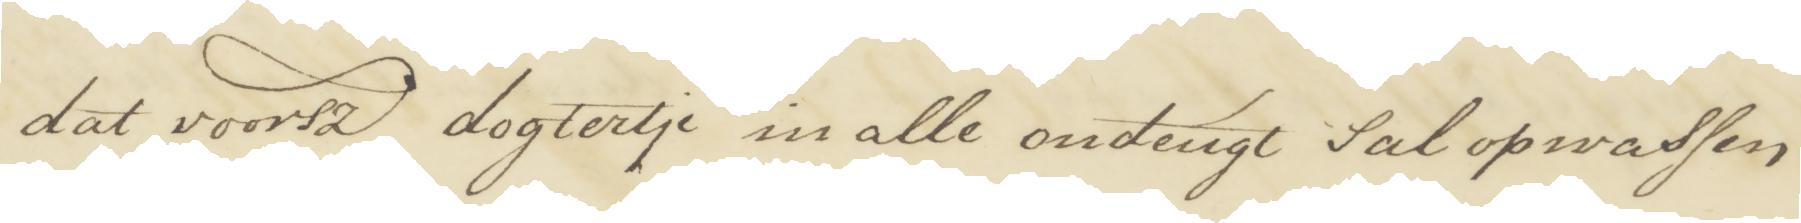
dat voorsz dogtertje in alle ondeugt sal opwassen
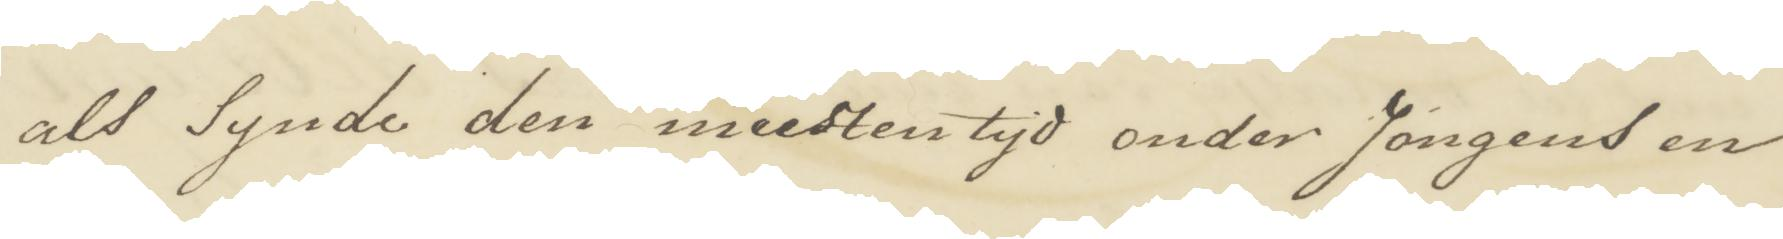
als synde den meesten tijd onder Jongens en
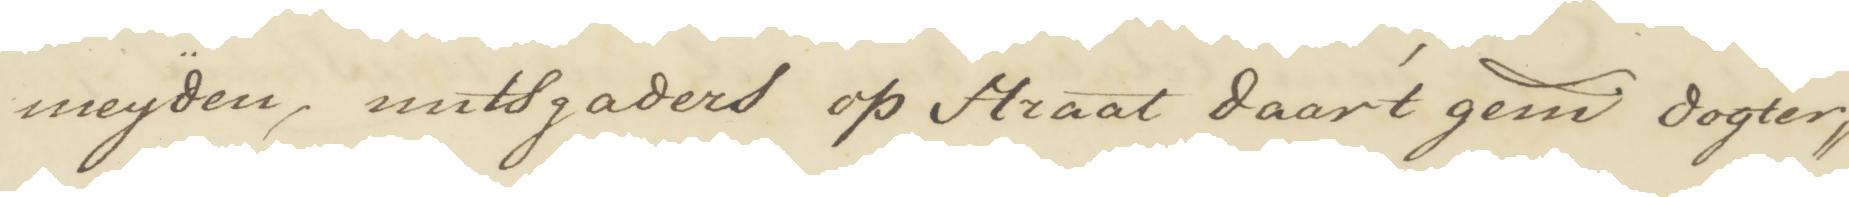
meijden, mitsgaders op straat daar’t gem dogter„
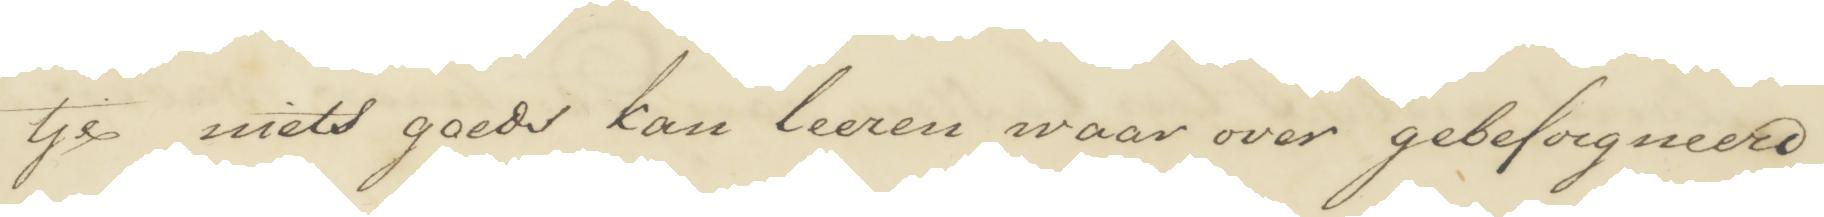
tje niets goeds kan leeren waar over gebesoigneerd
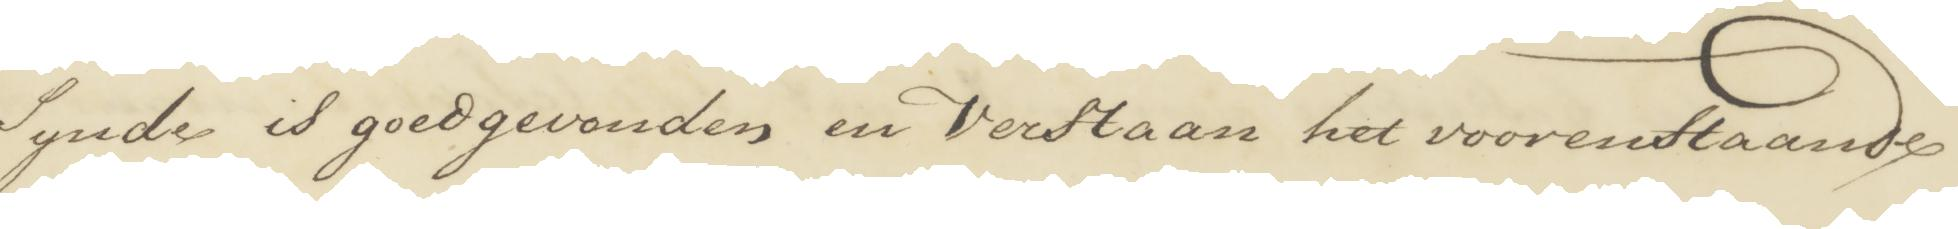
synde is goedgevonden en verstaan het voorenstaande
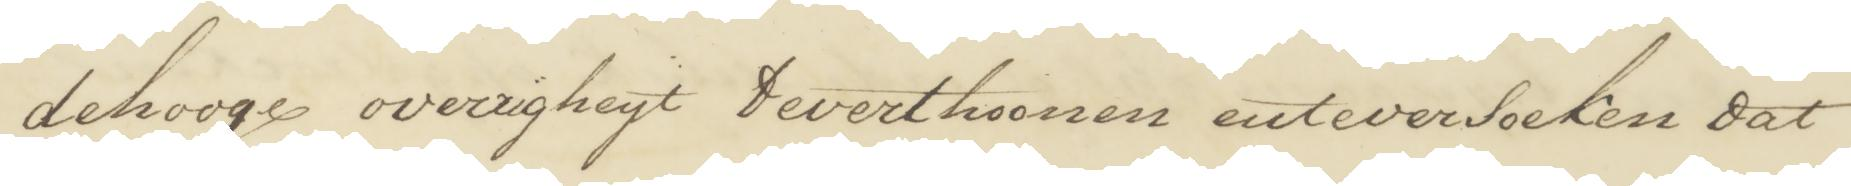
dehooge overrigheijt teverthoonen enteversoeken dat
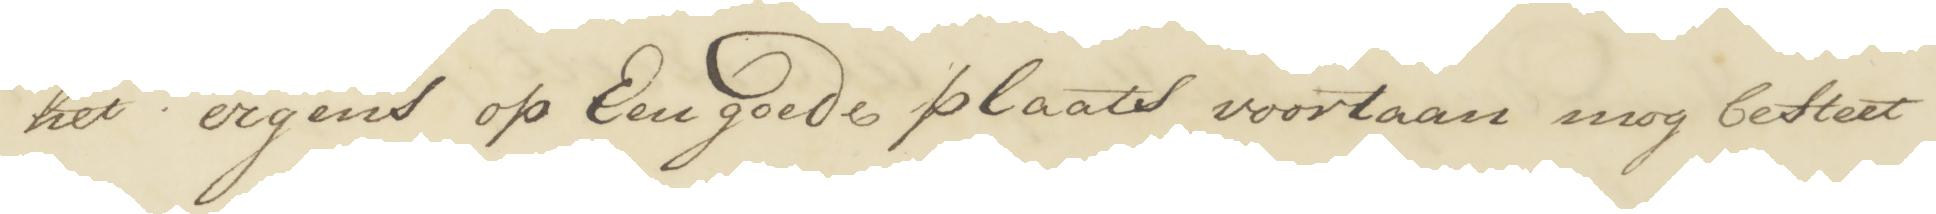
het ergens op Een goede plaats voortaan mog besteet
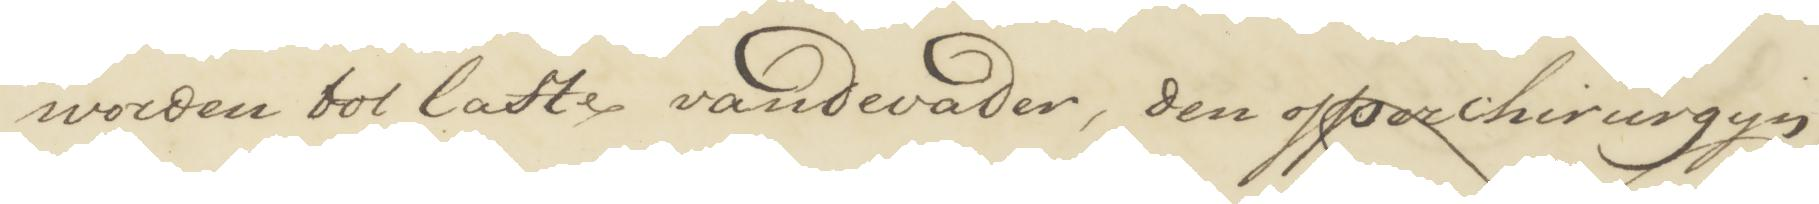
worden tot laste van de vader, den opperchirurgijn
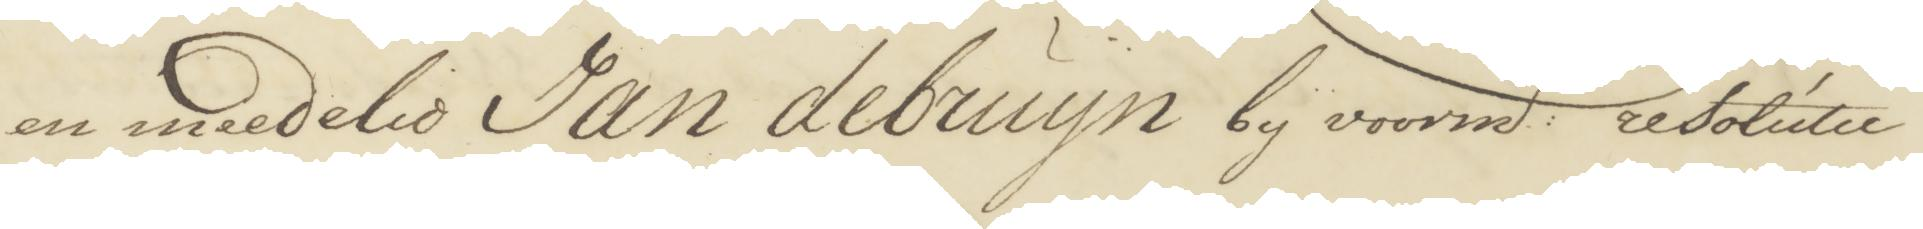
en meedelid Ian debruijn bij voorm: resolutie
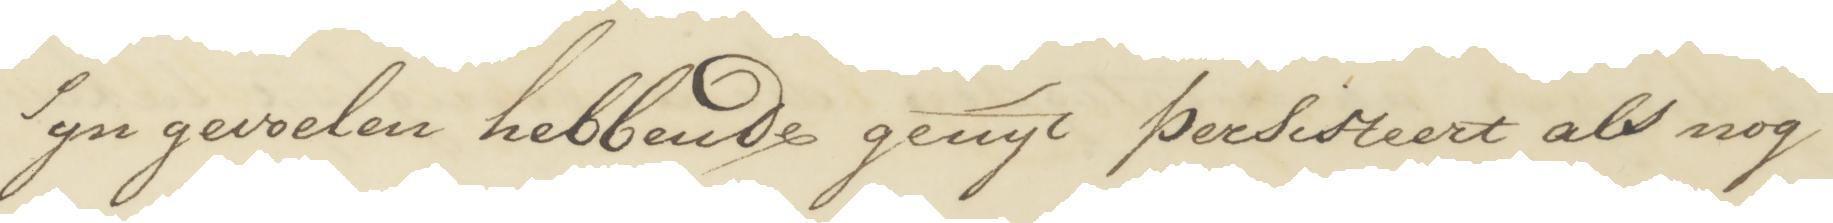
syn gevoelen hebbende geuyt persisteert als nog
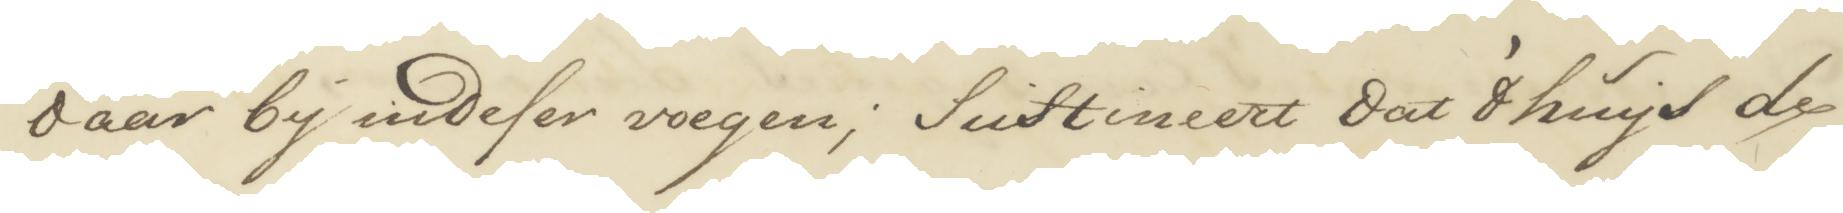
daar bij indeser voegen; sustineert dat 't huijs de
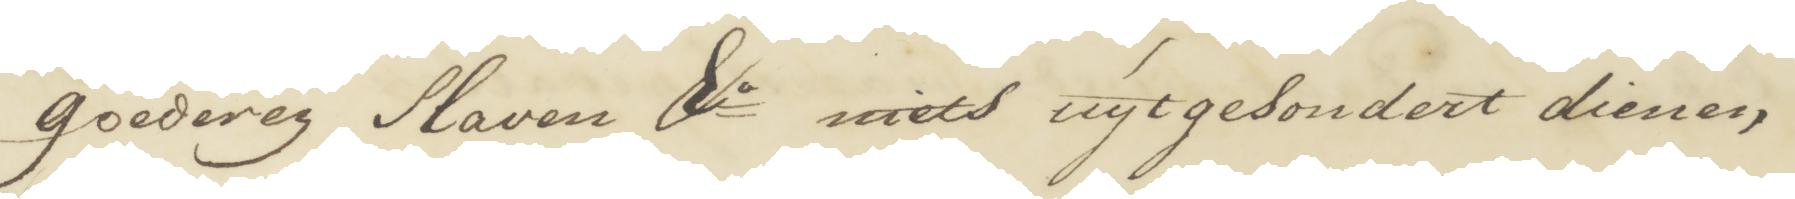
goederen slaven Etc=a niets uytgesondert dienen
